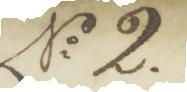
N:o 2.
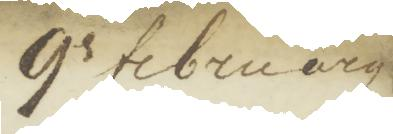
9en february
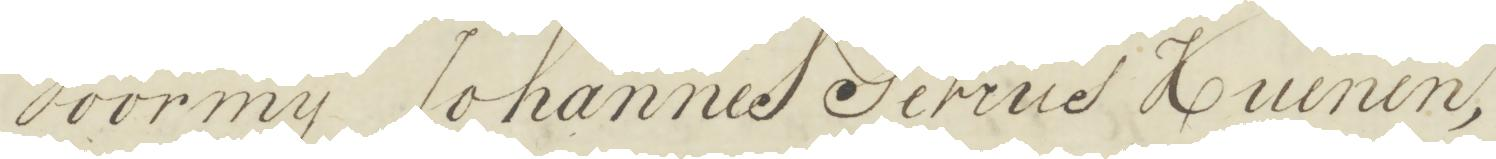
Door mij Johannes Petrus Kuenen,
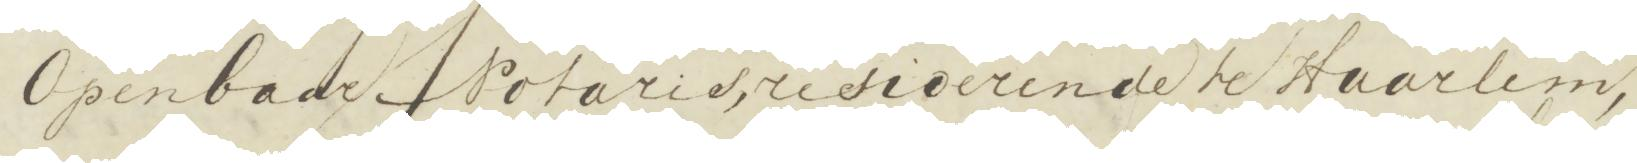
Openbaar Notaris, residerende te Haarlem,
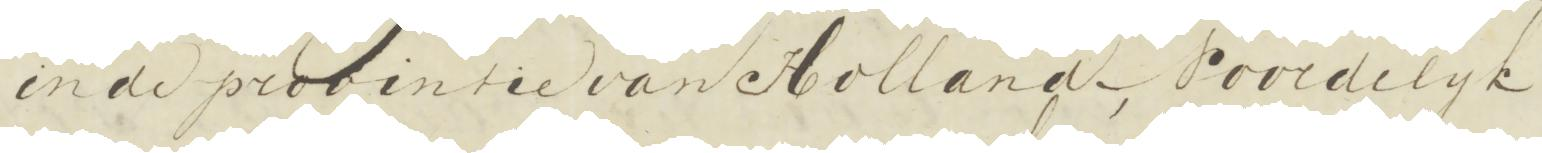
in de provintie van Holland, Noordelyk
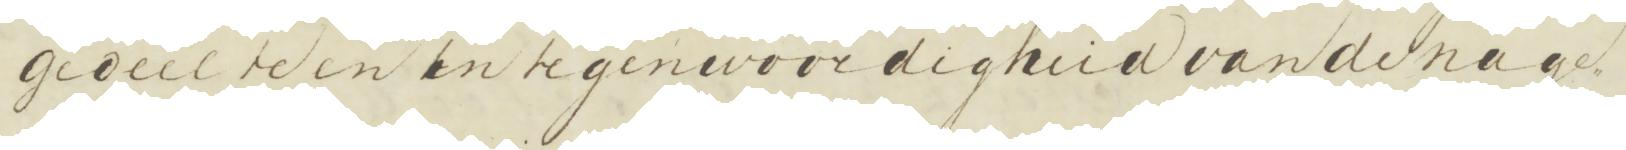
gedeelte en ten tegenwoordigheid van de nage„
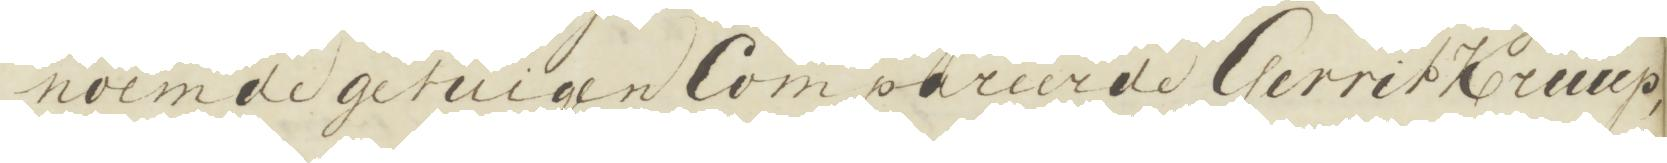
noemde getuigen Compareerde Gerrit Kruup,
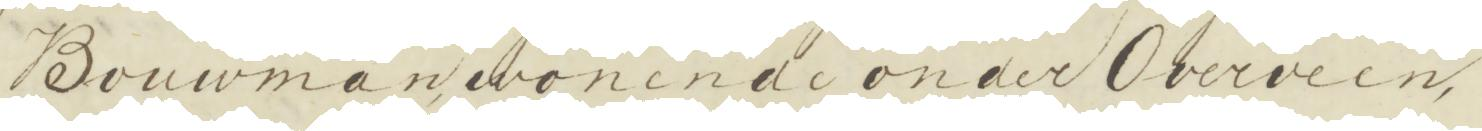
Bouwman, wonende onder Overveen,
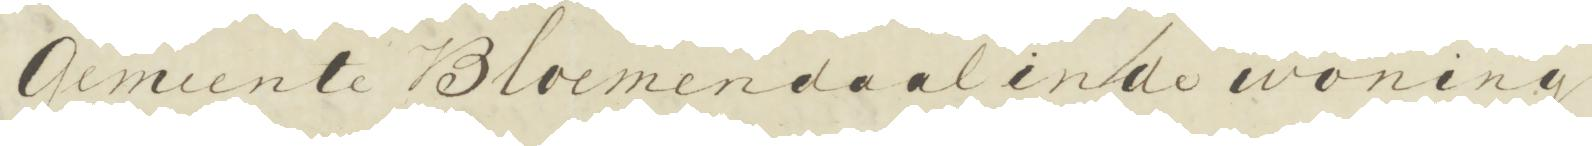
Gemeente Bloemendaal in de woning
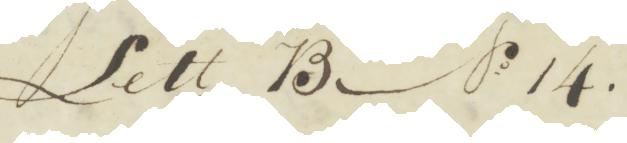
Lett B N.o 14.
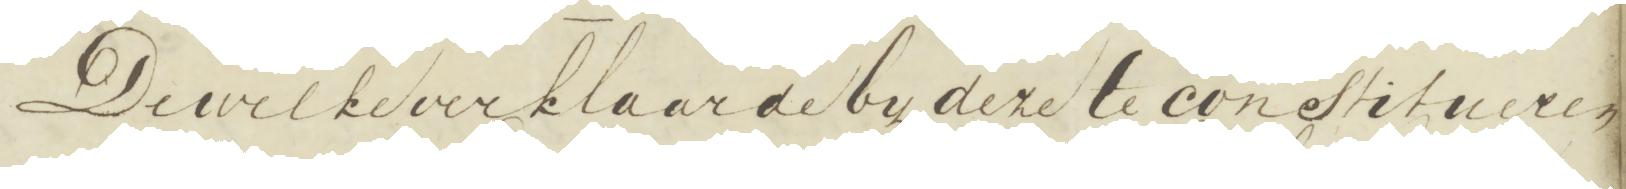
Dewelke verklaarde by deze te constitueren
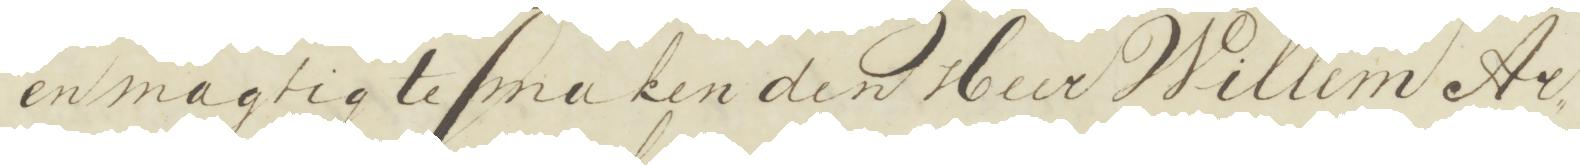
en magtig te maken den Heer Wilhem Ar„
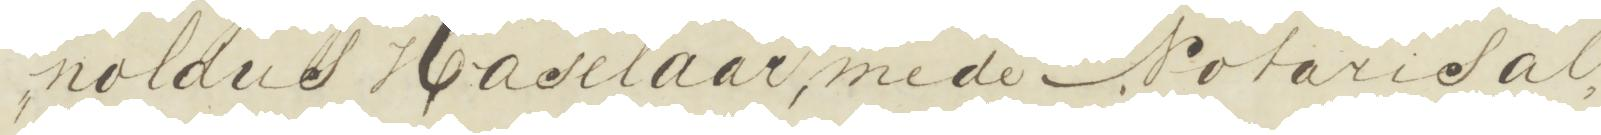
„noldus Haselaar, mede Notaris al„
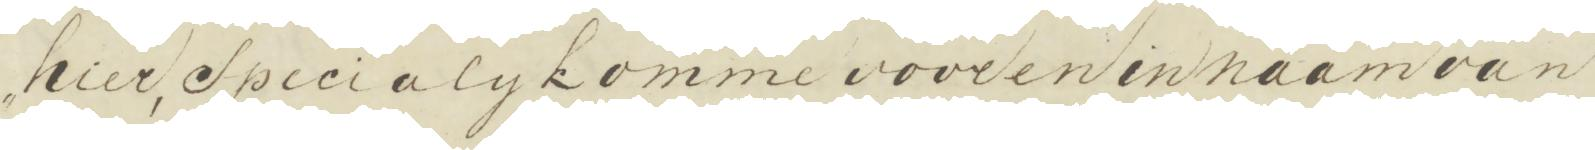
„hier, specialyk omme voor en in naam van
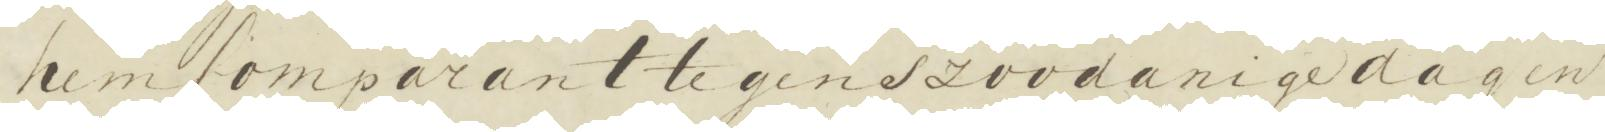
hem comparant tegens zoodanige dag en
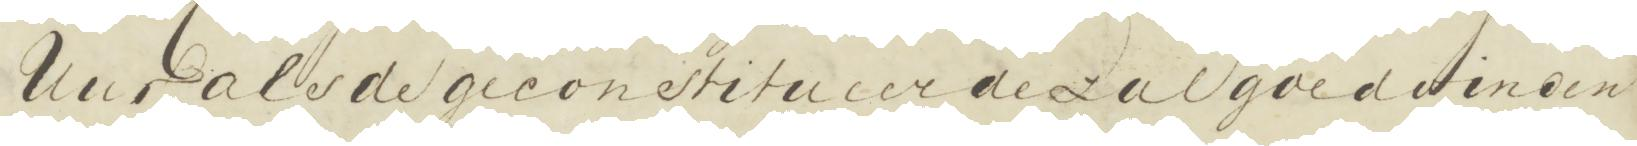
Uur als de geconstitueerde zal goedvinden
